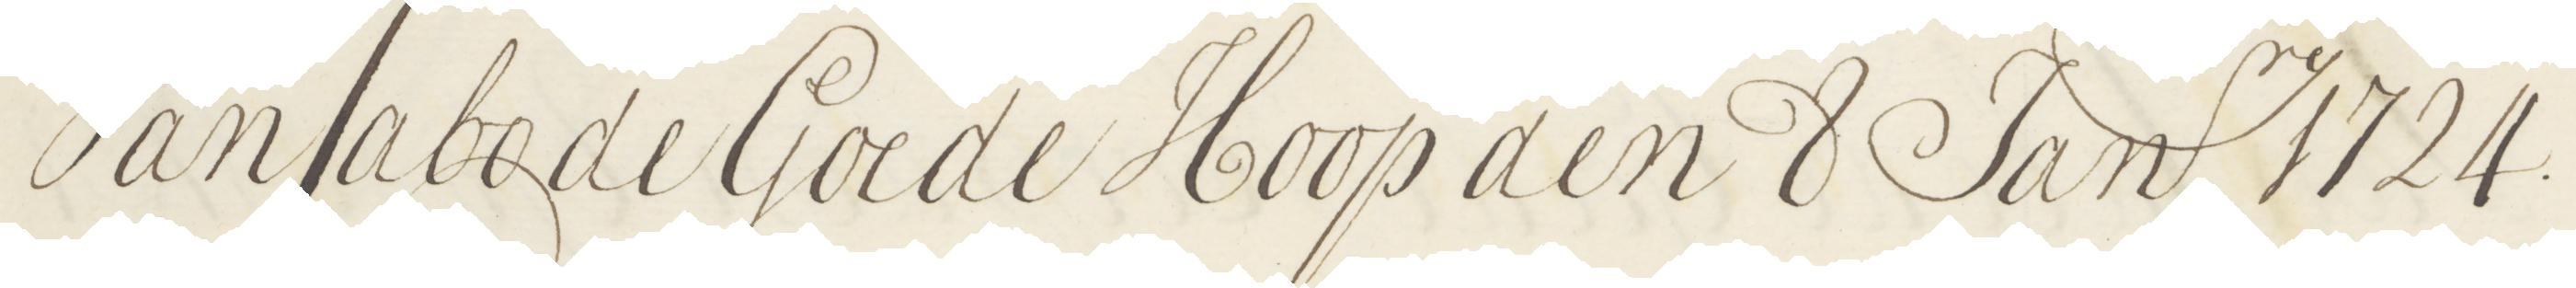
Van Cabo de Goede Hoop den 8 Ian.ry 1724.
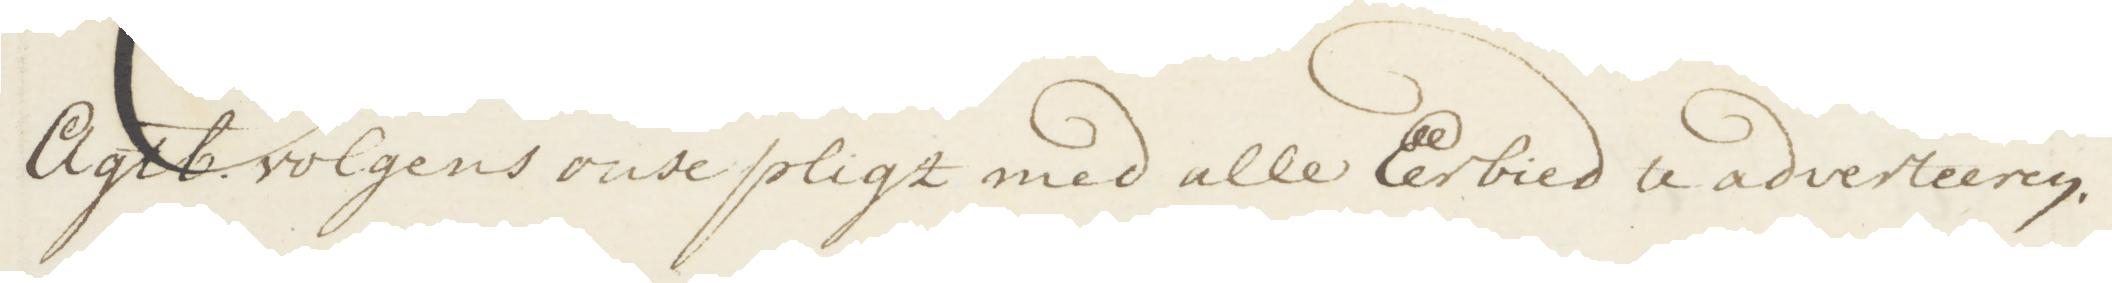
Agtb. volgens onse pligt med alle Eerbied te adverteeren.
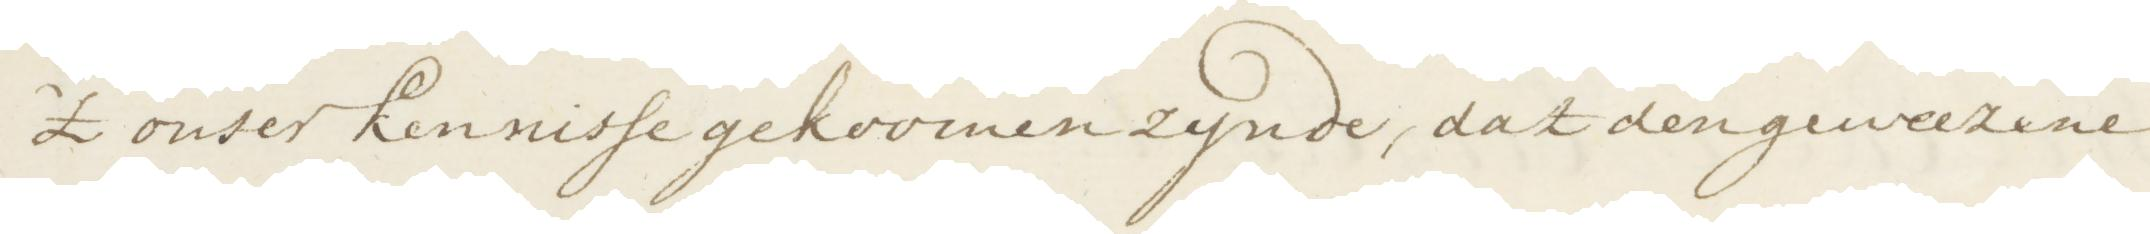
’t onser kennisse gekoomen zynde, dat den geweezene
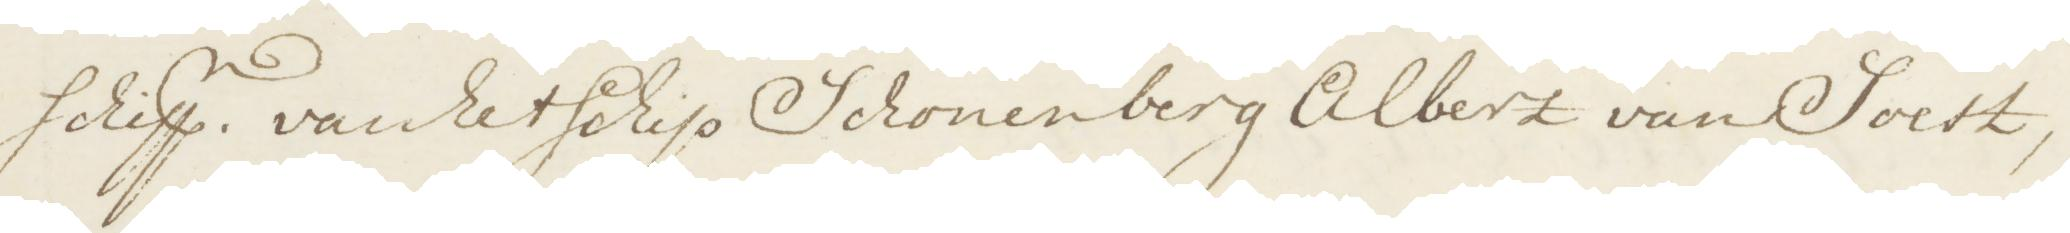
schipp.r van het schip Schonenberg Albert van Soest,
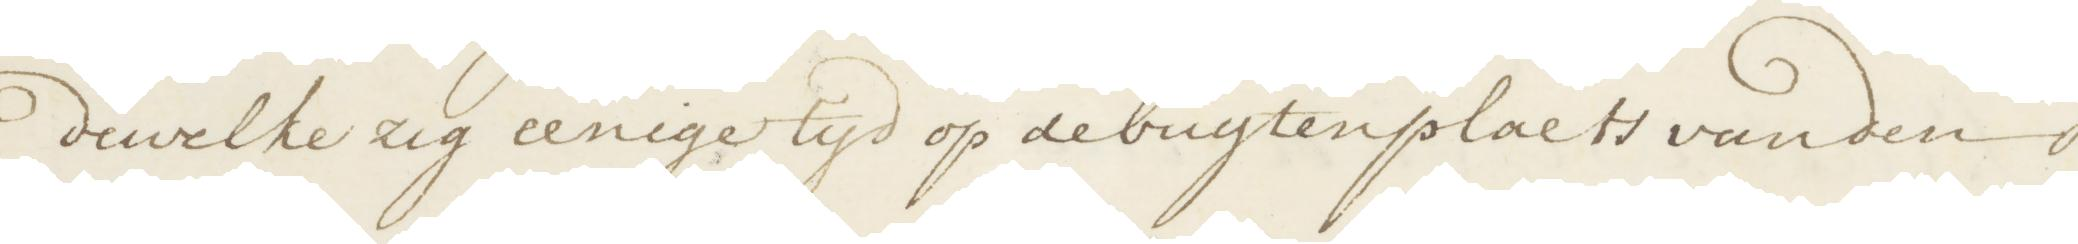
dewelke zig eenige tyd op de buytenplaets van den
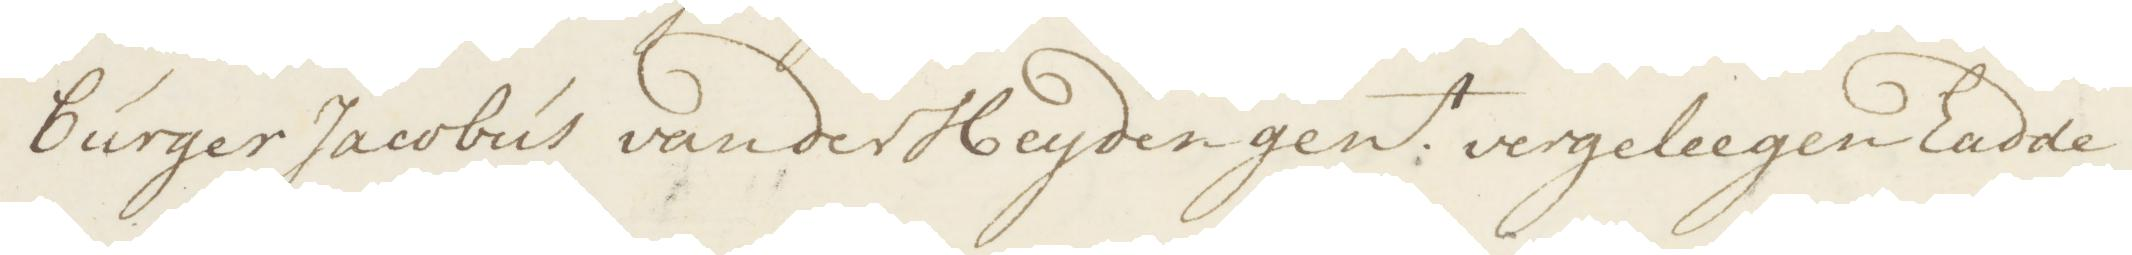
burger Jacobus van der Heyden gen.t vergeleegen hadde
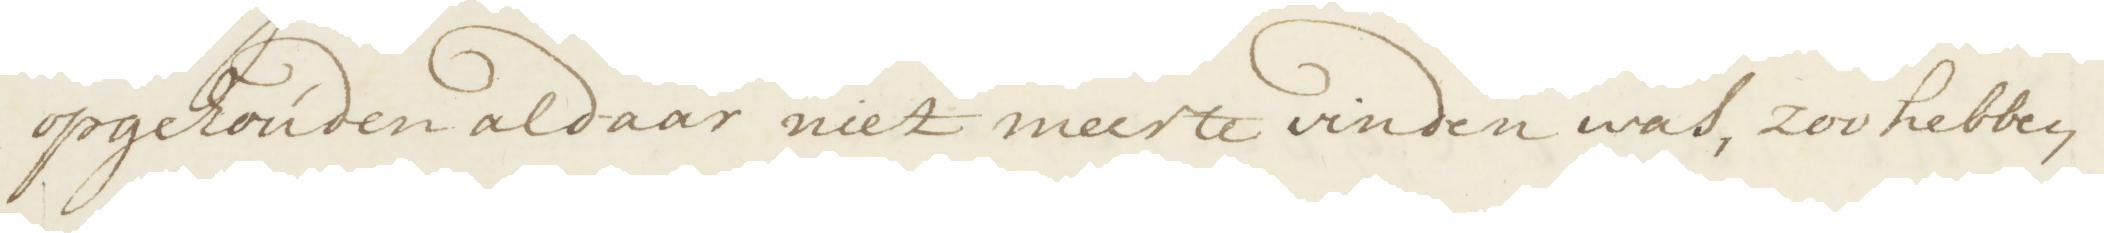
opgehouden aldaar niet meerte vinden was, zoo hebben
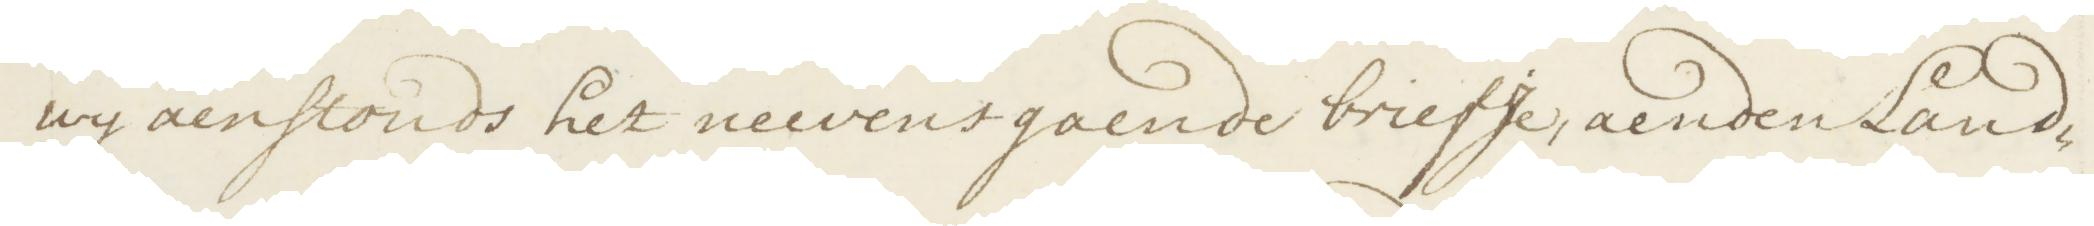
wy aenstonds het neevens gaende briefje, aenden Land„
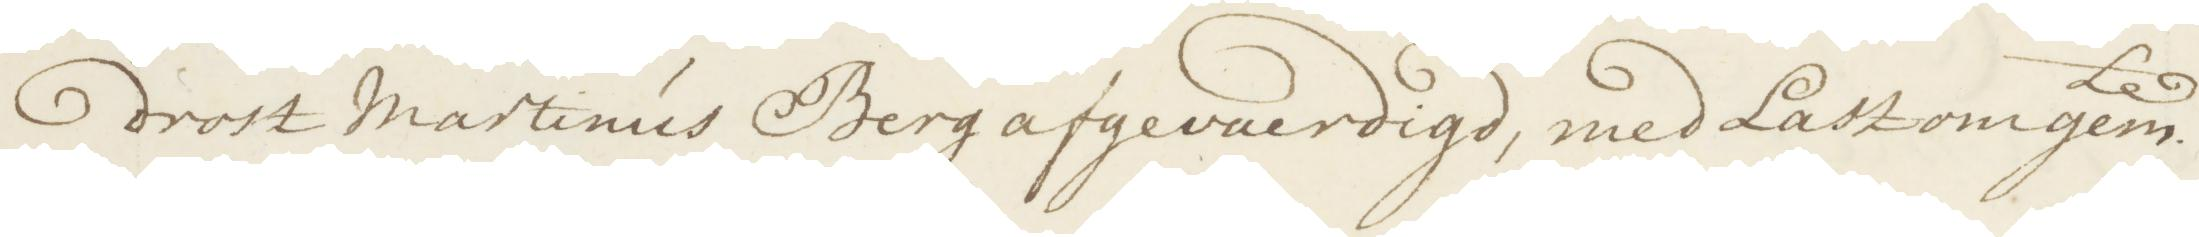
drost martinus Berg afgevaerdigd, med Last om gem.te
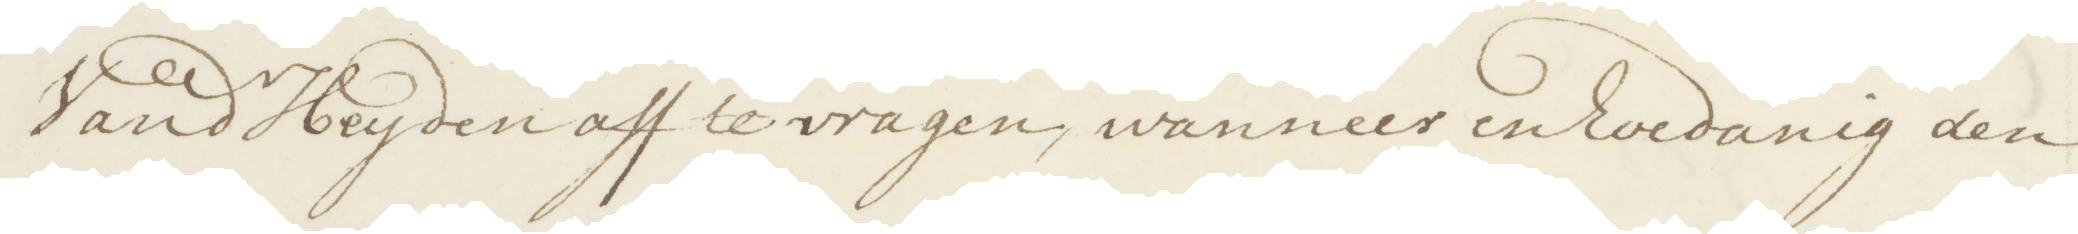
Vand Heijden aff te vragen, wanneer en hoedanig den
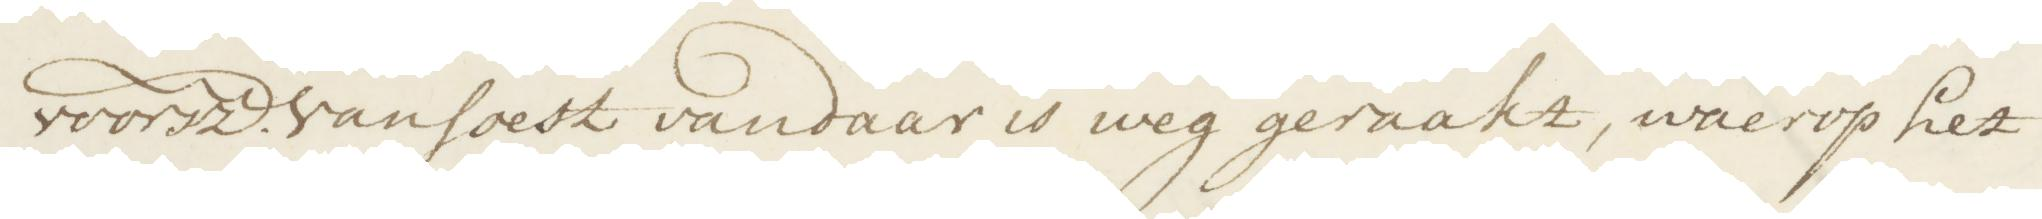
voorsz. van soest vandaar is weg geraakt, waerop het
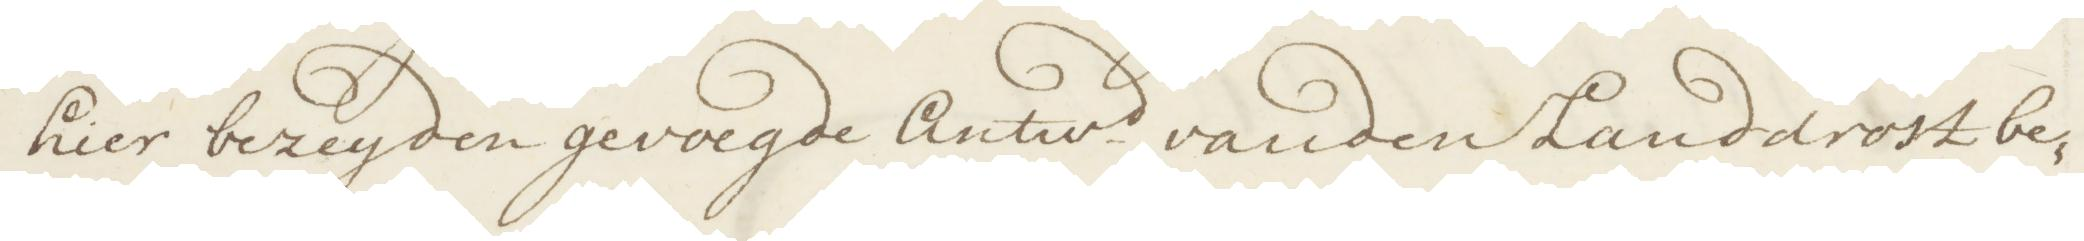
hier bezeyden gevoegde antw.d van den Landdrost be„
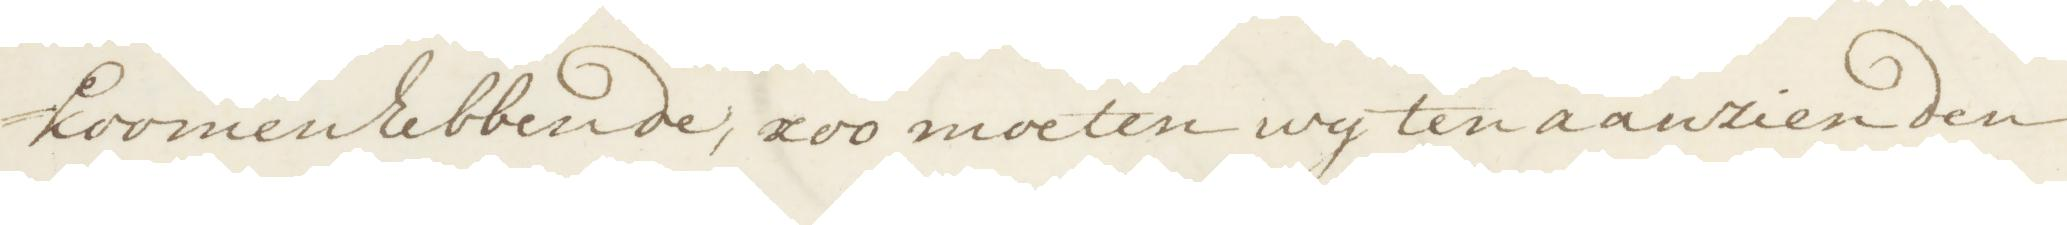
=koomen hebbende, zoo moeten wij ten aanzien den
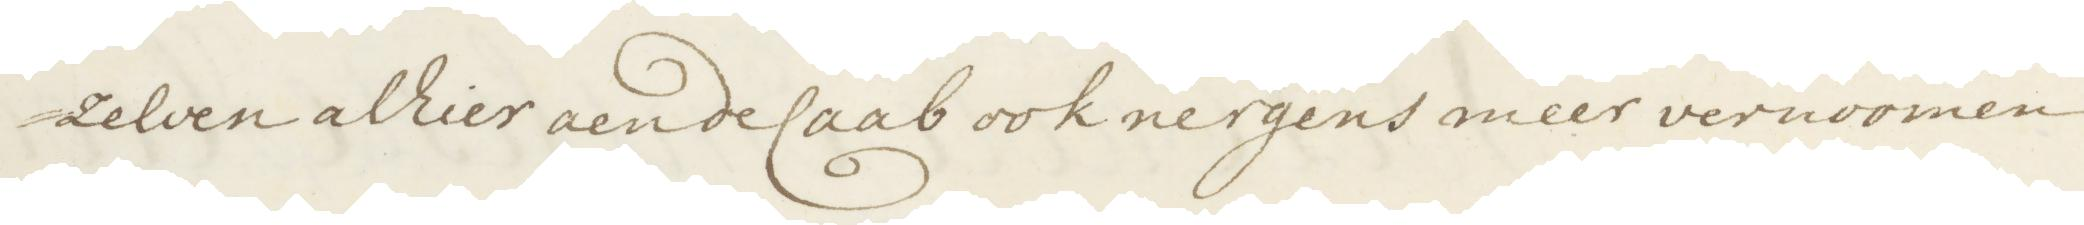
=zelven alhier aen de caab ook nergens meer vernoomen
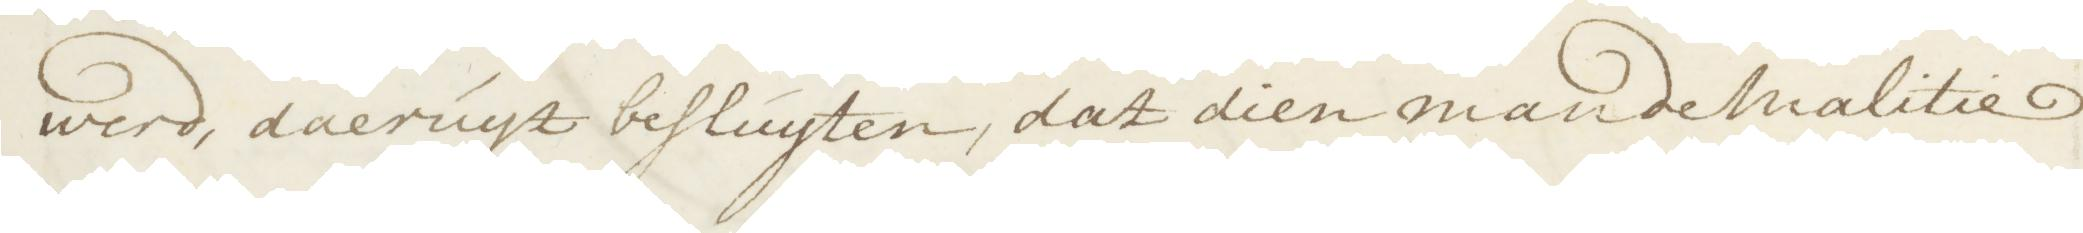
werd, daeruyt besluyten, dat dien man de malitie
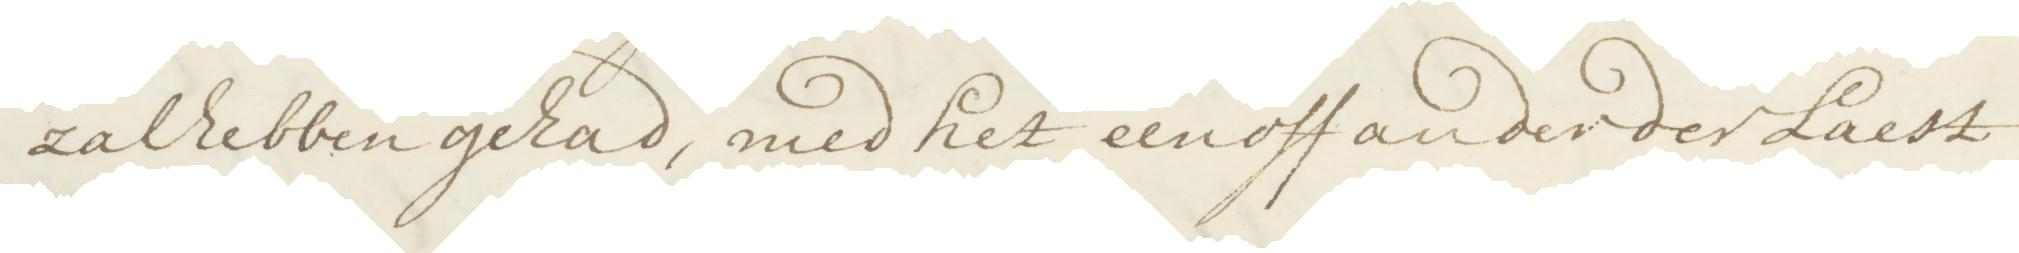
zal hebben gehad, med het een off ander der Laest
